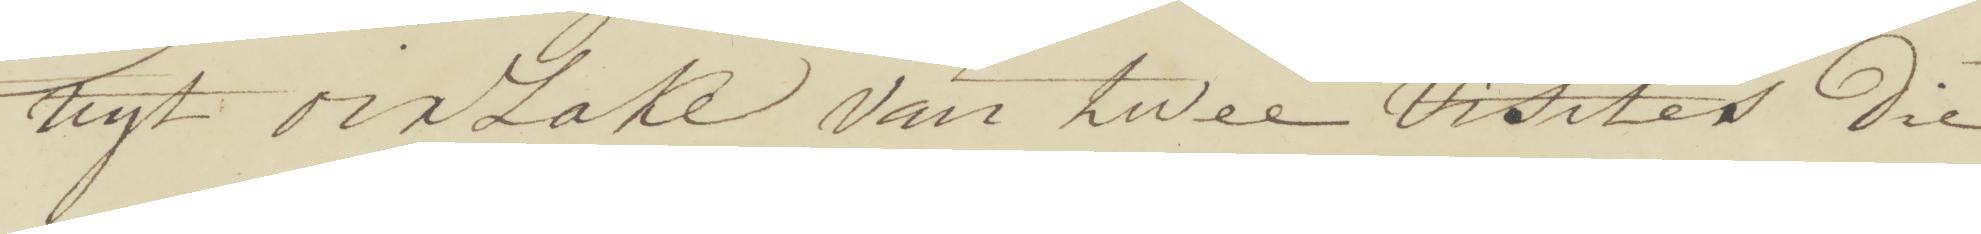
uyt oirzake van twee visites die
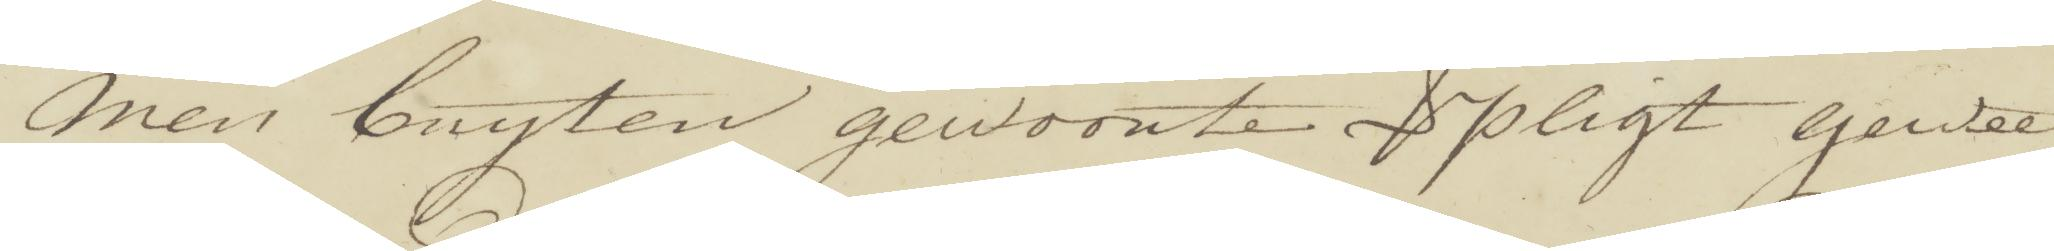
men buyten gewoonte verpligt geweest
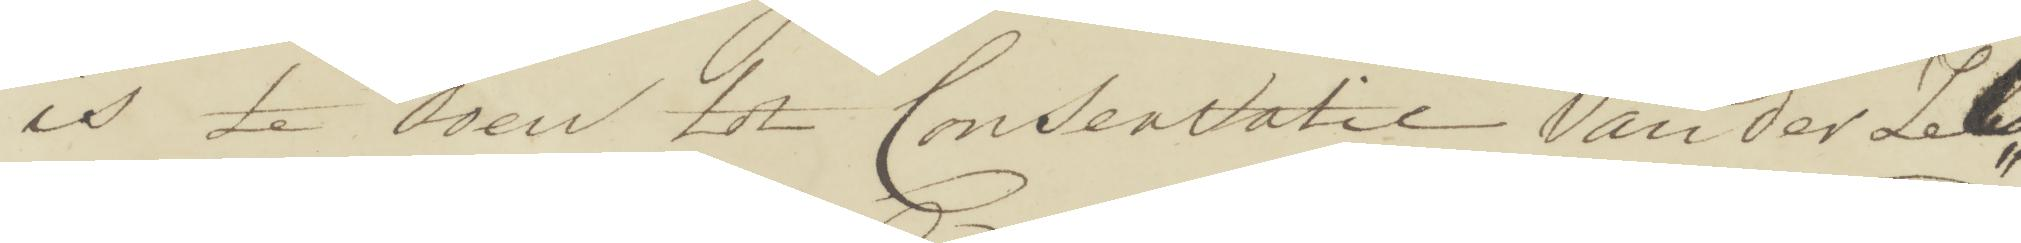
is te doen tot Conservatie van der zel„
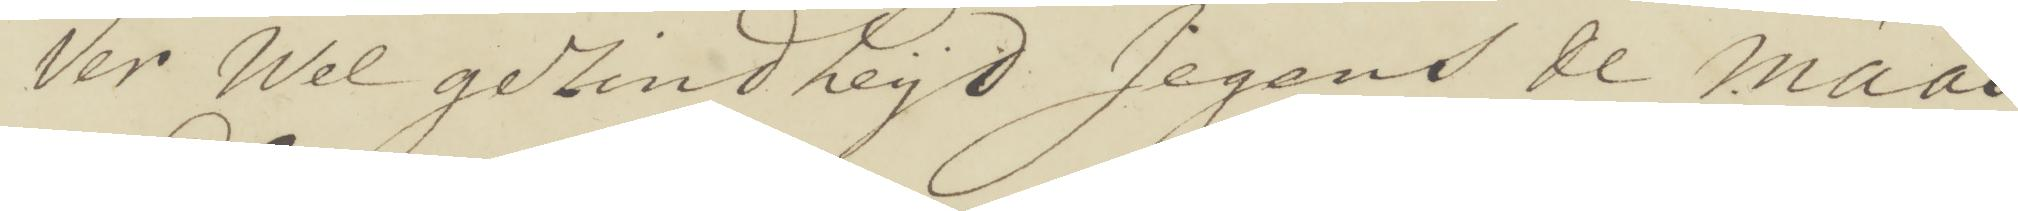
ver wel gezindheijd Jegens de maad
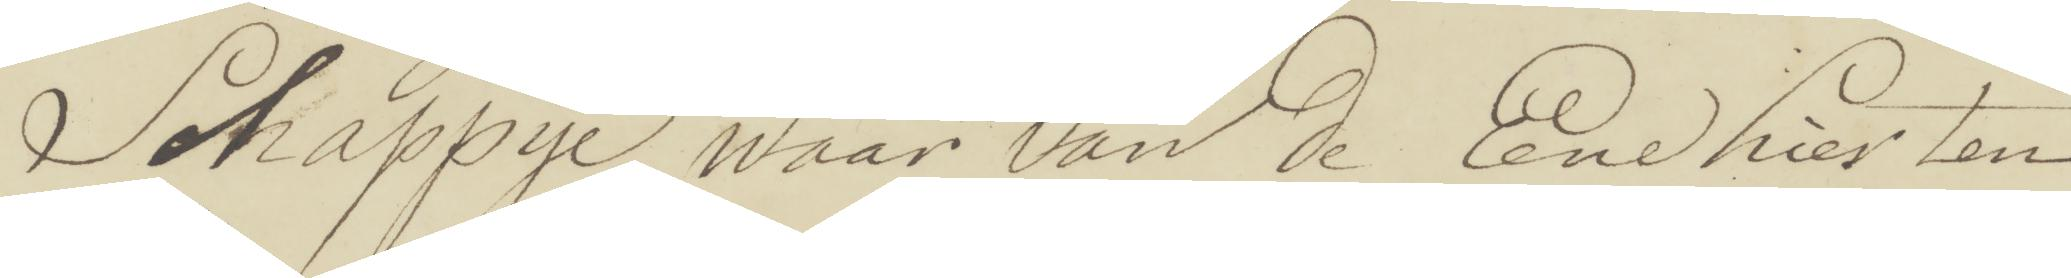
Schappije waar van de Eene hier ten
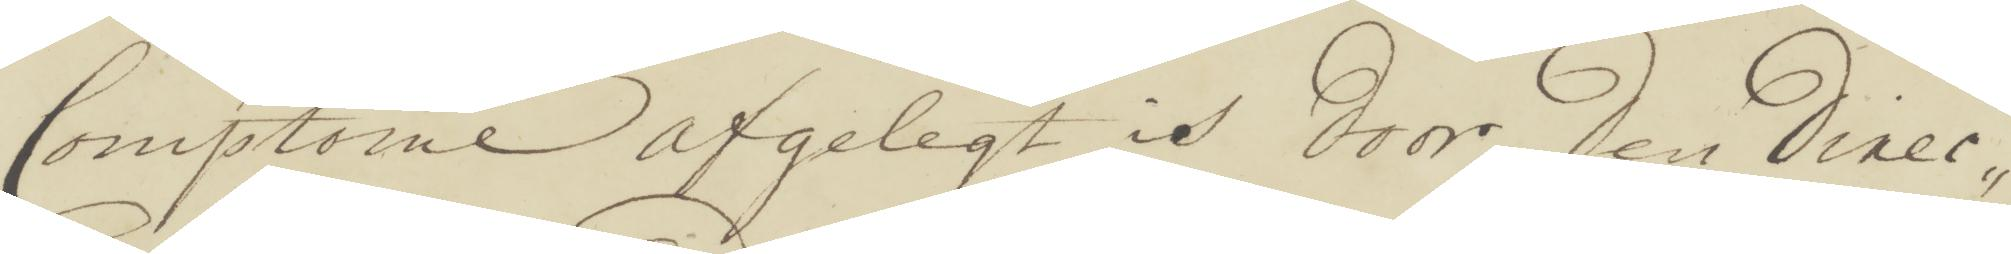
Comptoire afgelegt is door den direc„
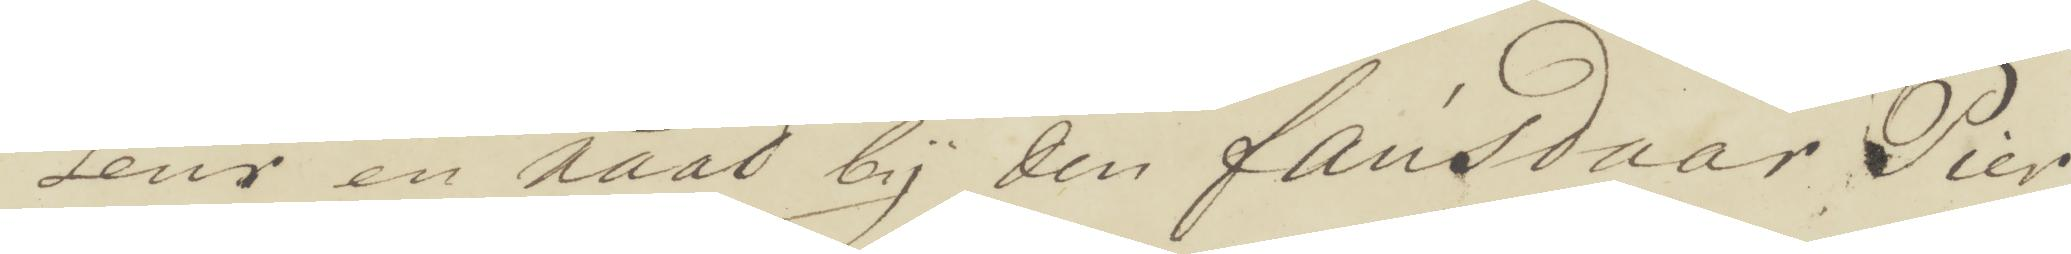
teur en raad bij den faus daar Pier
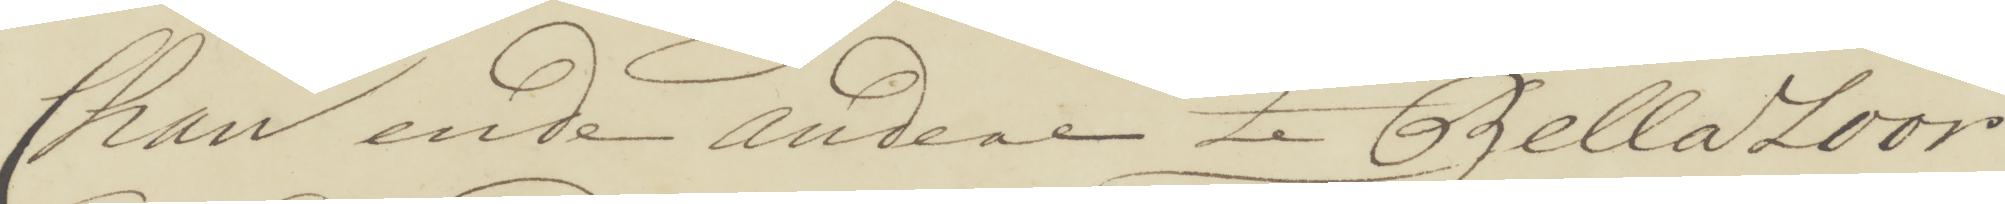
Chan ende andere te Bellazoor
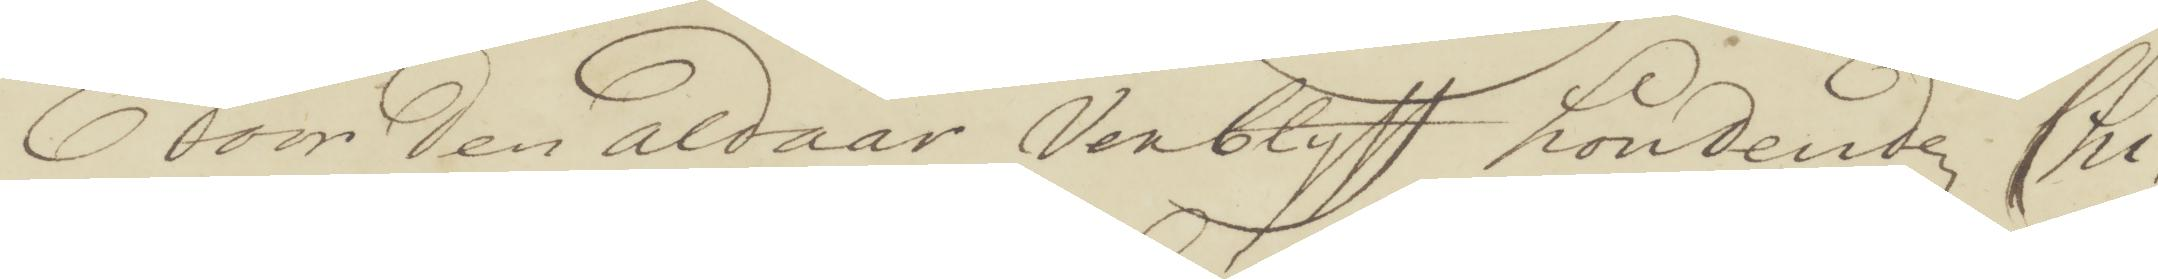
door den aldaar verblyff houdende Chi
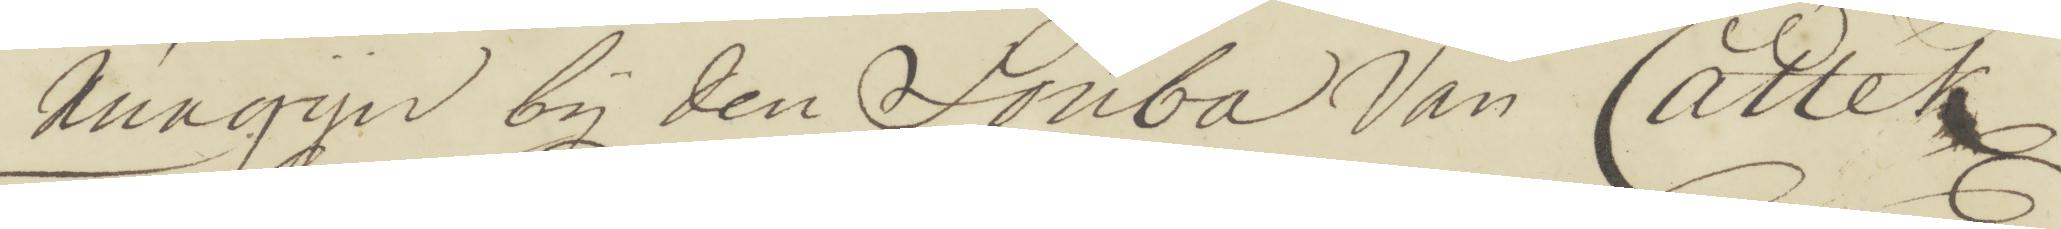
rurgijn bij den Souba van Cattek
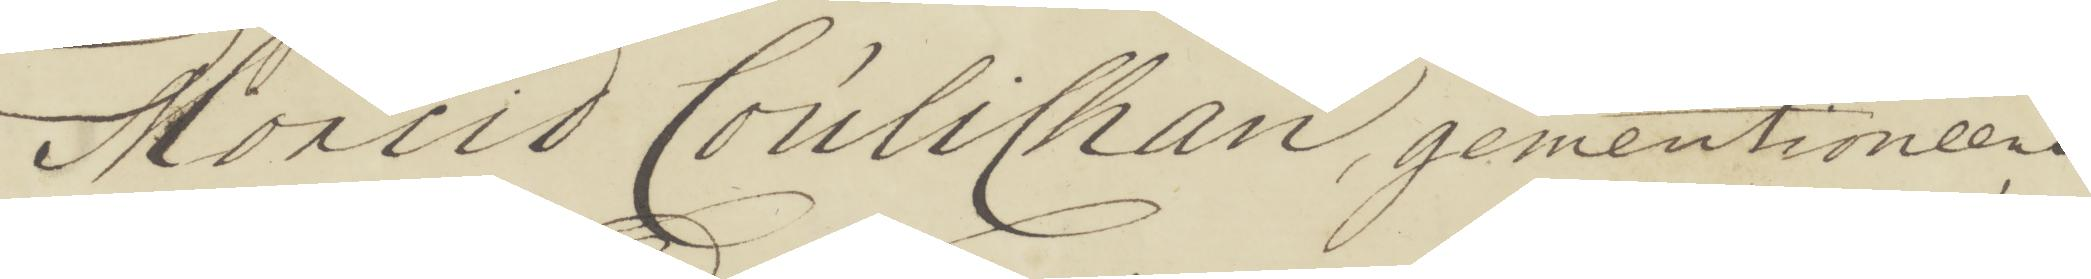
Morcid Coulichan, gementioneerd
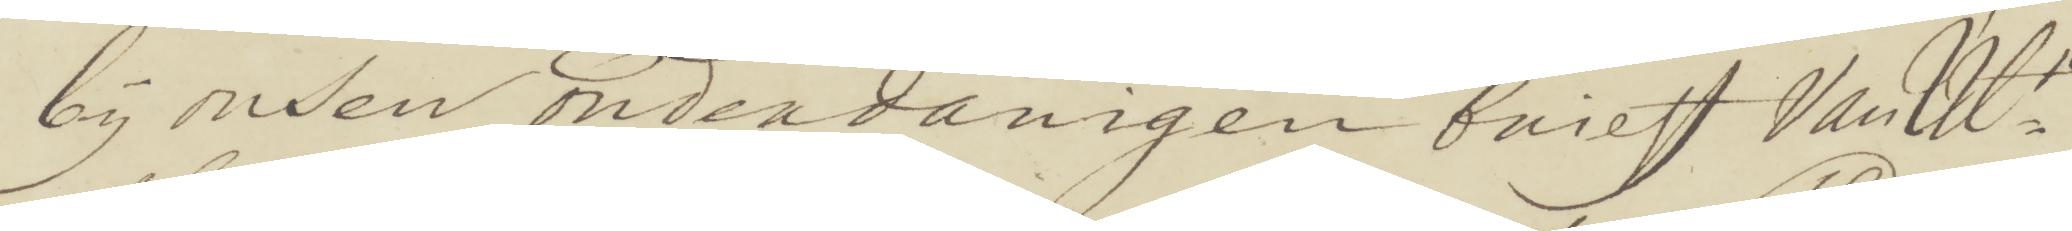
bij onsen onderdanigen brieff van Ul=to
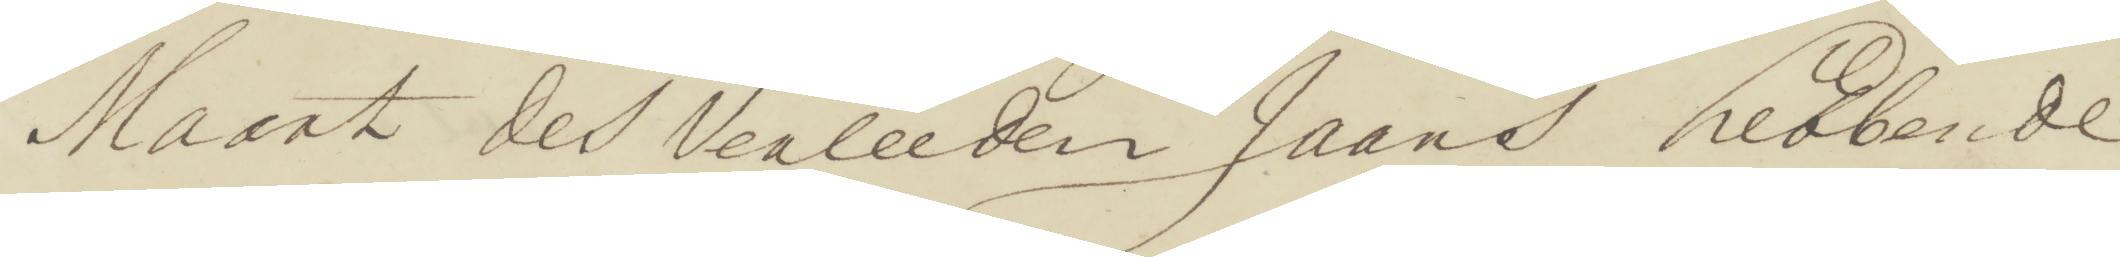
Maart des verleeden Jaars hebbende
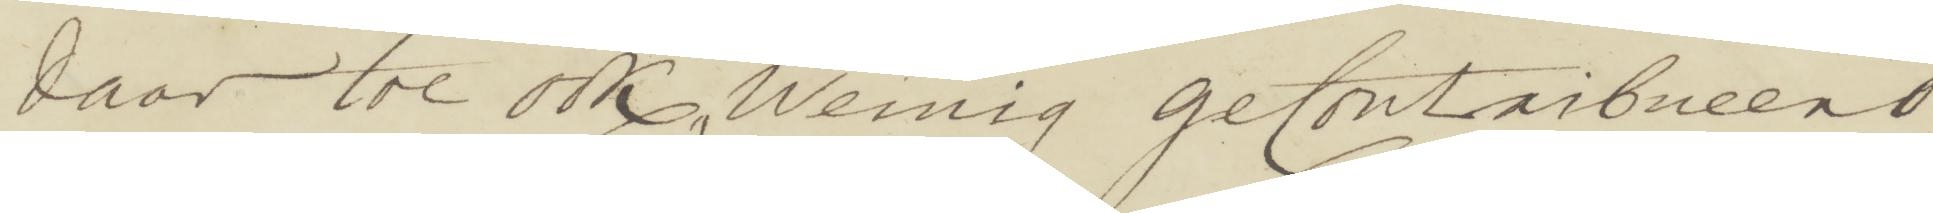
daar toe ook „ weinig gecontribueerd
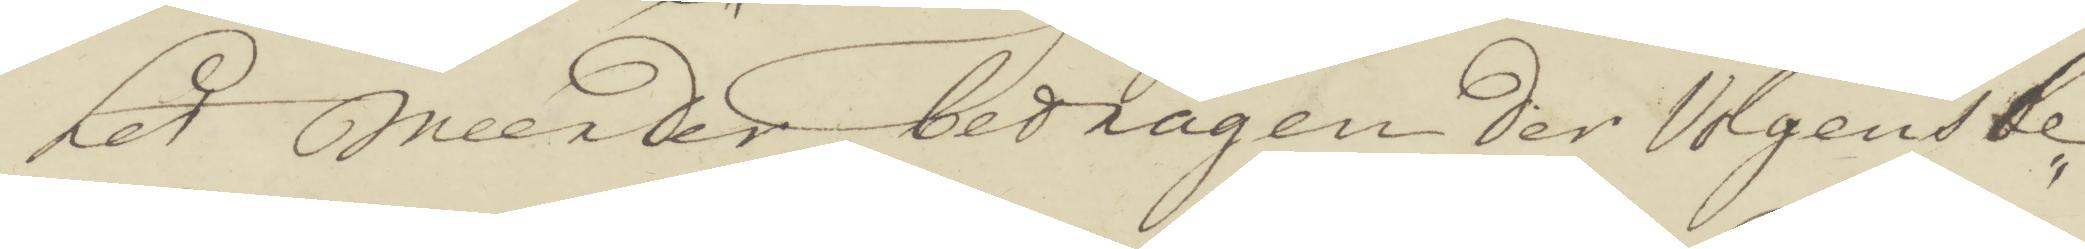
het meerder bedragen der vogens be„
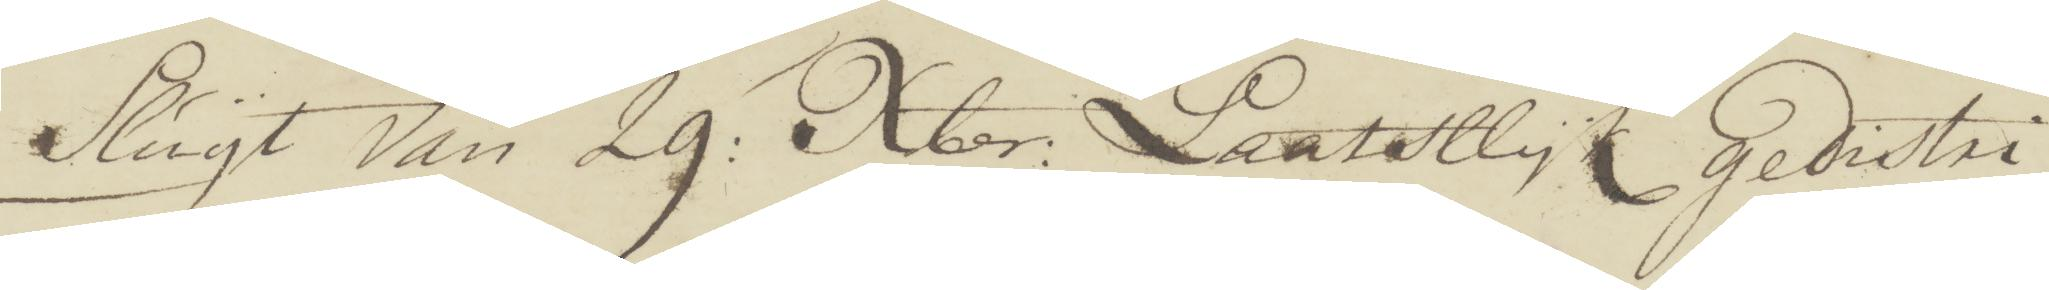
sluijt van 29:' xber: Laatstlijk gedistri
